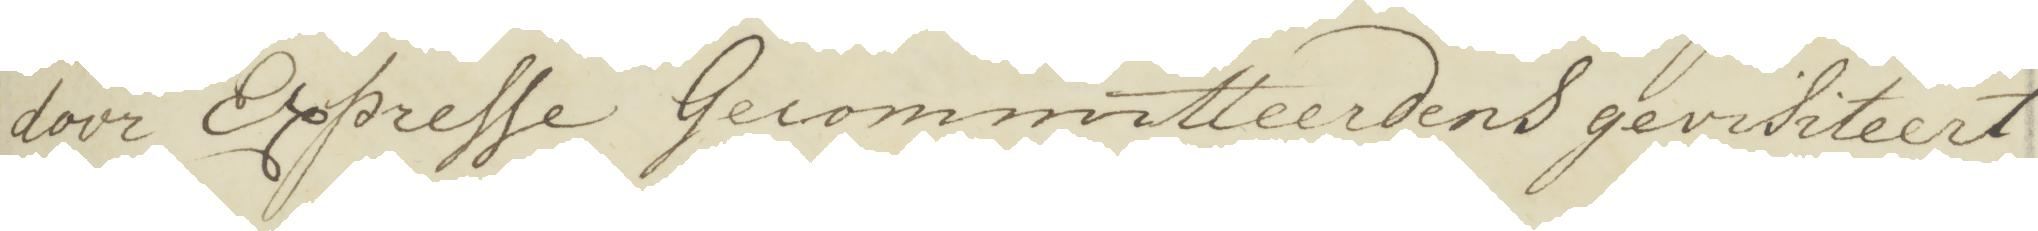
door Expresse Gecommitteerdens gevisiteert
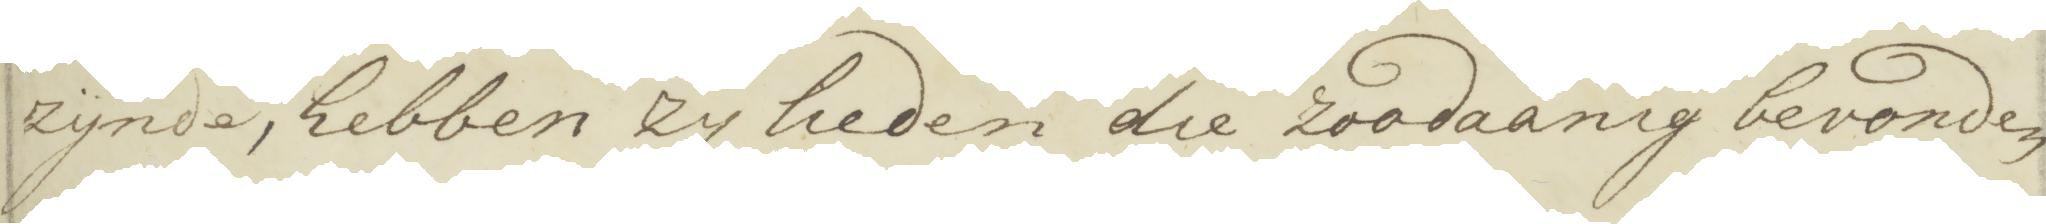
zijnde, hebben zij lieden die zoodaanig bevonden,
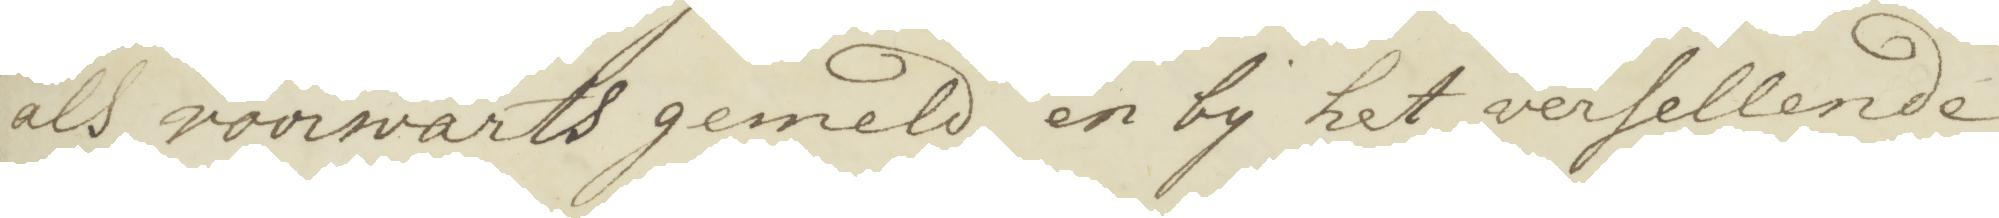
als voorwarts gemeld en bij het versellende
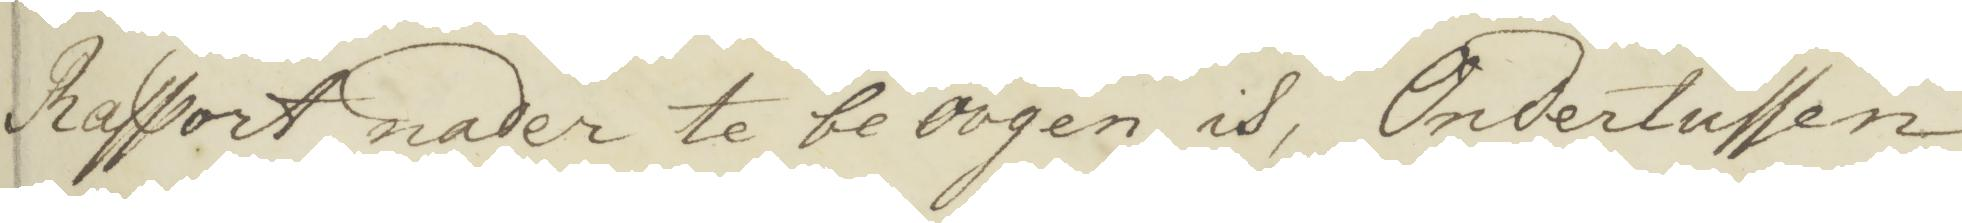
Rapport nader te be oogen is, Ondertussen
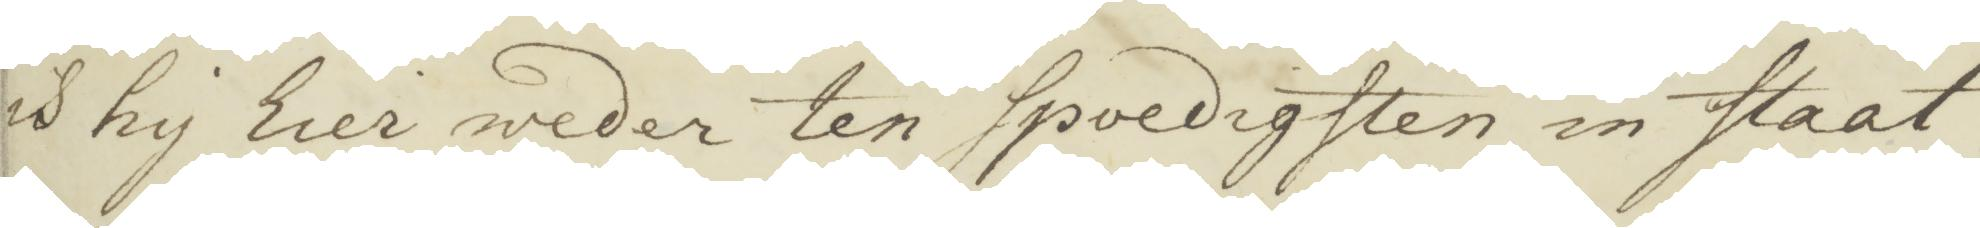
is hij hier weder ten spoedigsten in staat
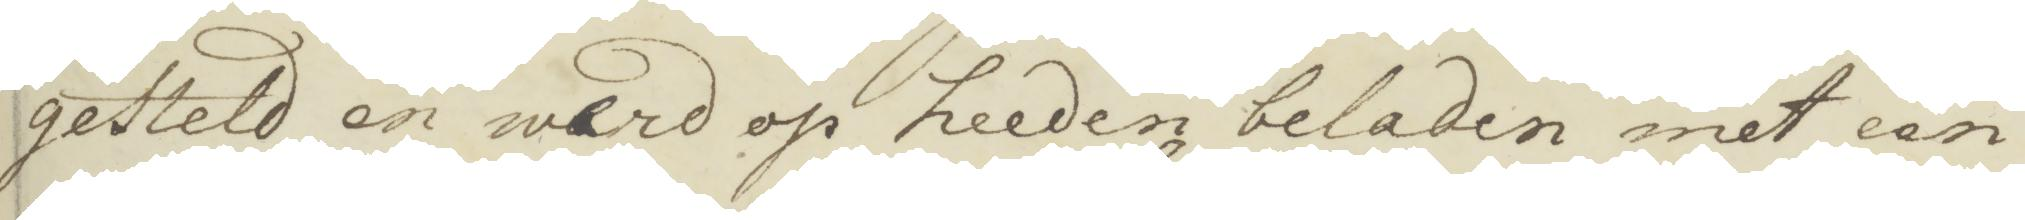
gesteld en werd op heeden beladen met een
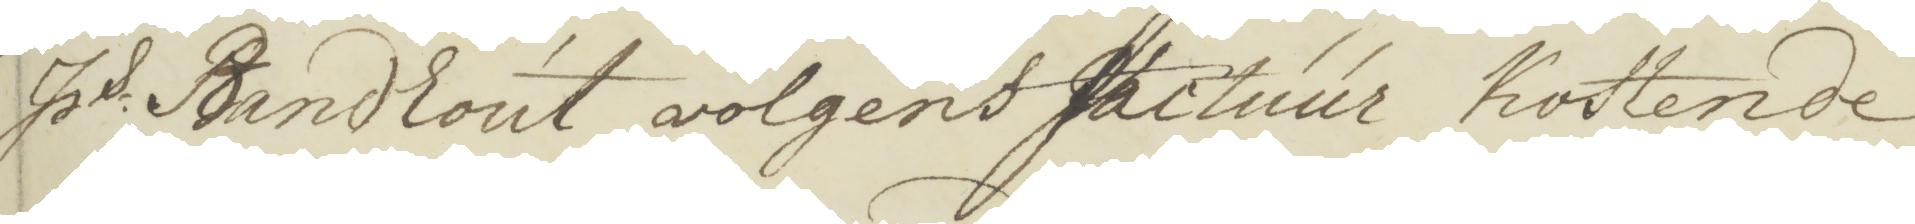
p:s Bandhout volgens factuur kostende
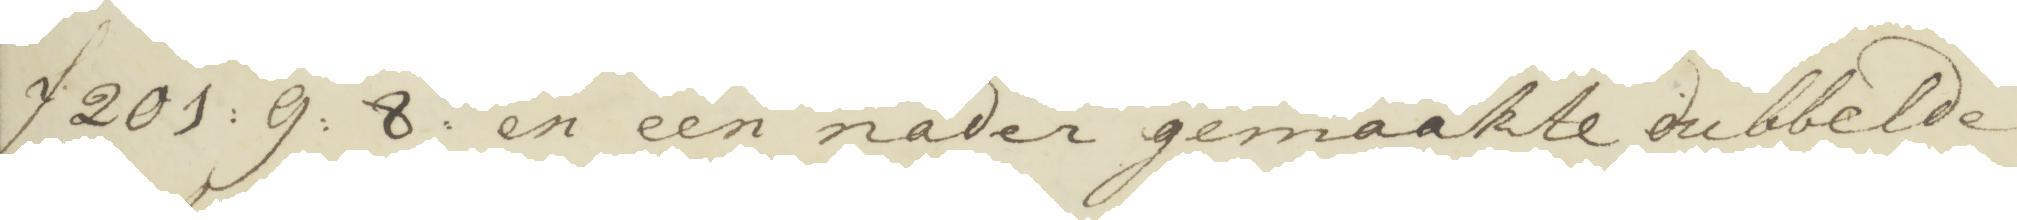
ƒ201:9:8: en een nader gemaakte dubbelde
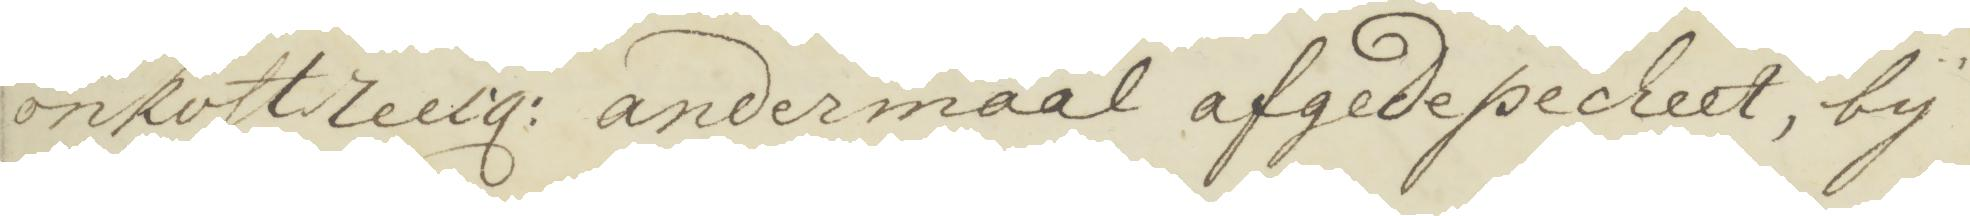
onkost reecq: andermaal afgedepecheet, bij
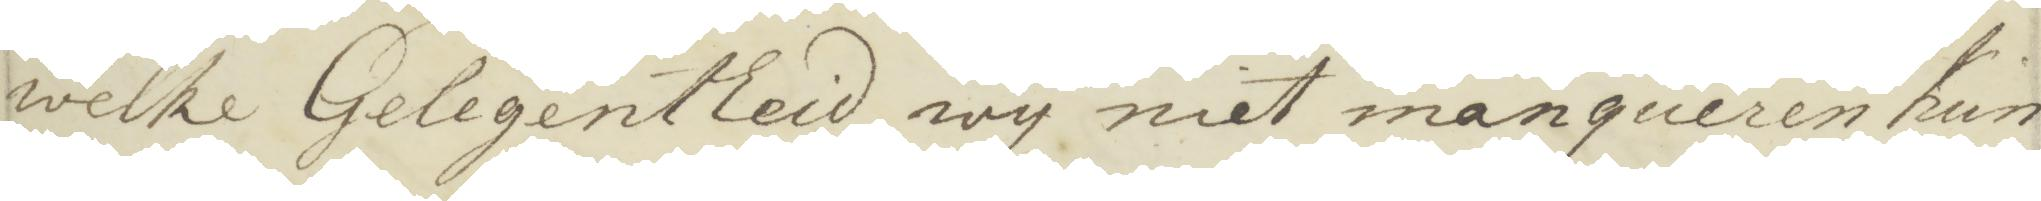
welke Gelegentheid wij niet manqueren hun
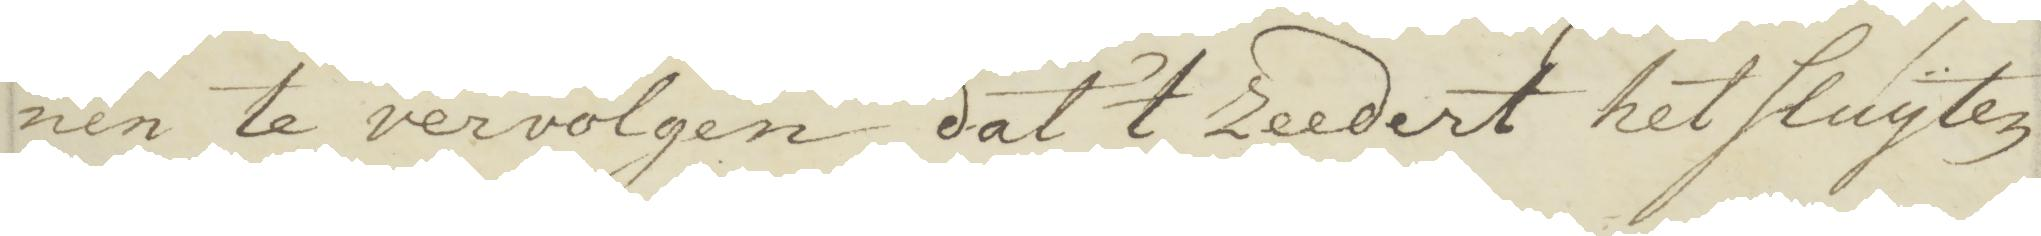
nen te vervolgen dat ’t zeedert het sluijten
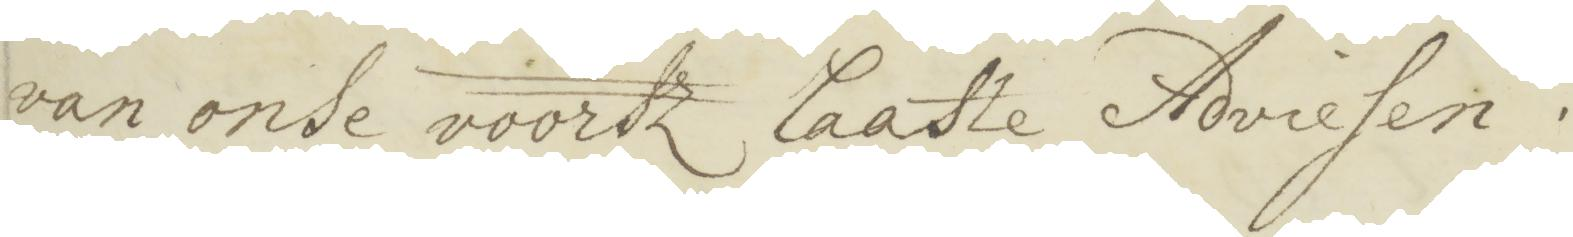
van onse voorsz laaste Adviesen:
